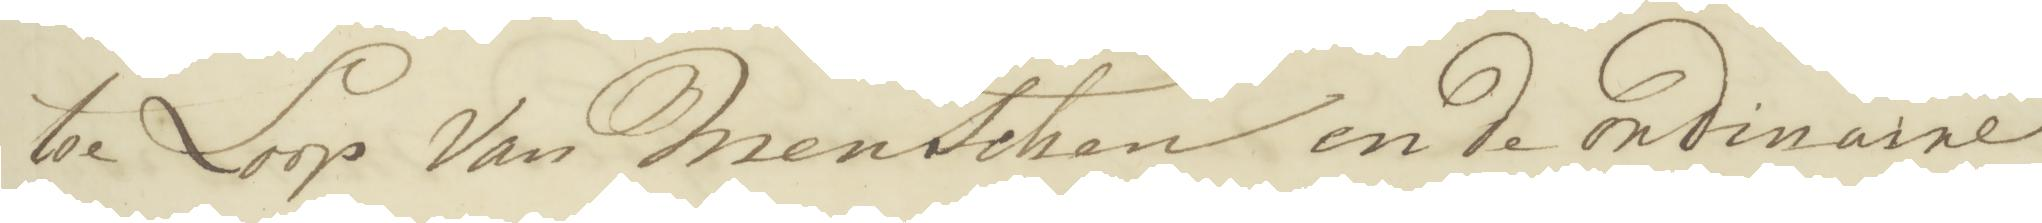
toe Loop van menschen en de ondinaire
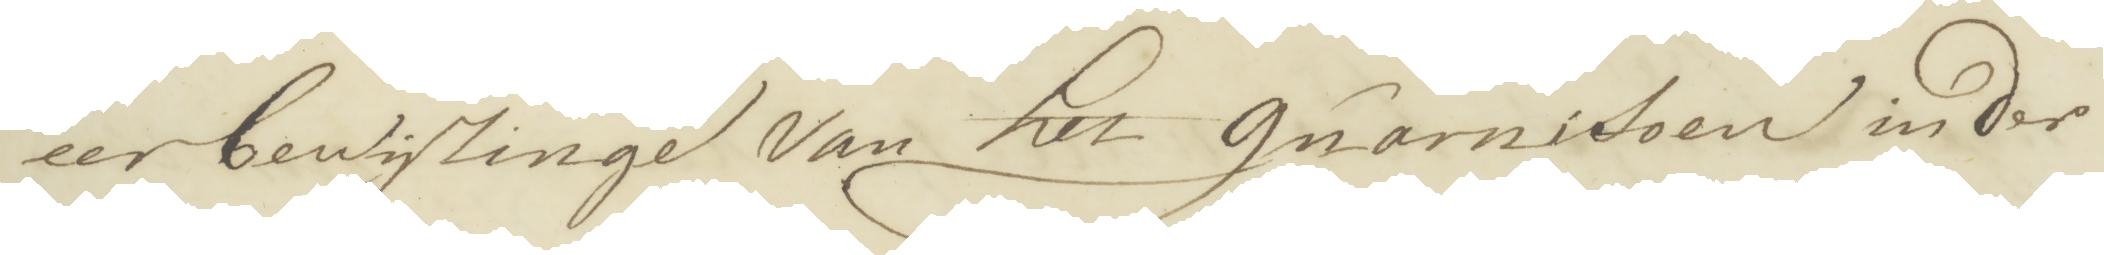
eerbewijzinge van het guarnisoen in der
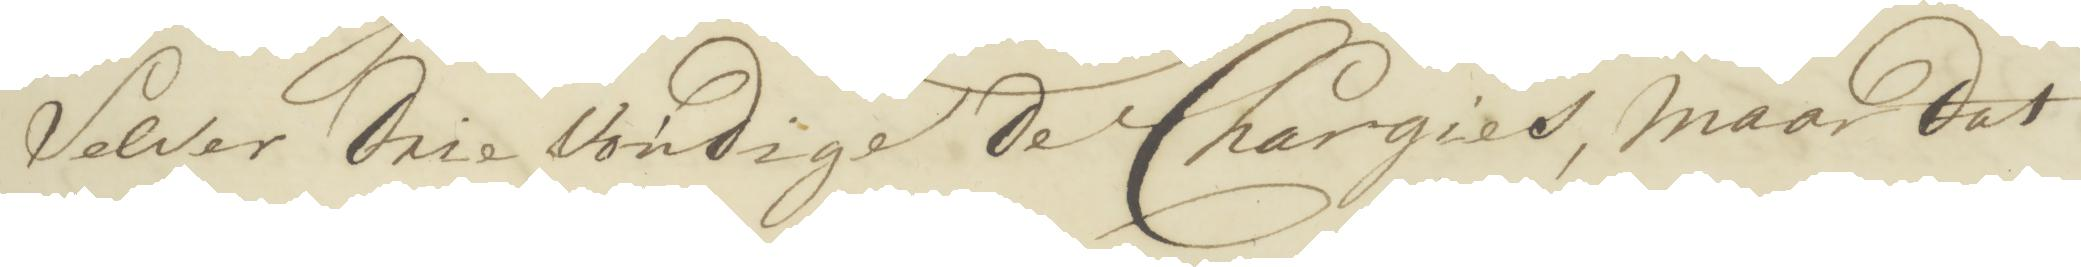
selver drie voudige de Chargies, maar dat
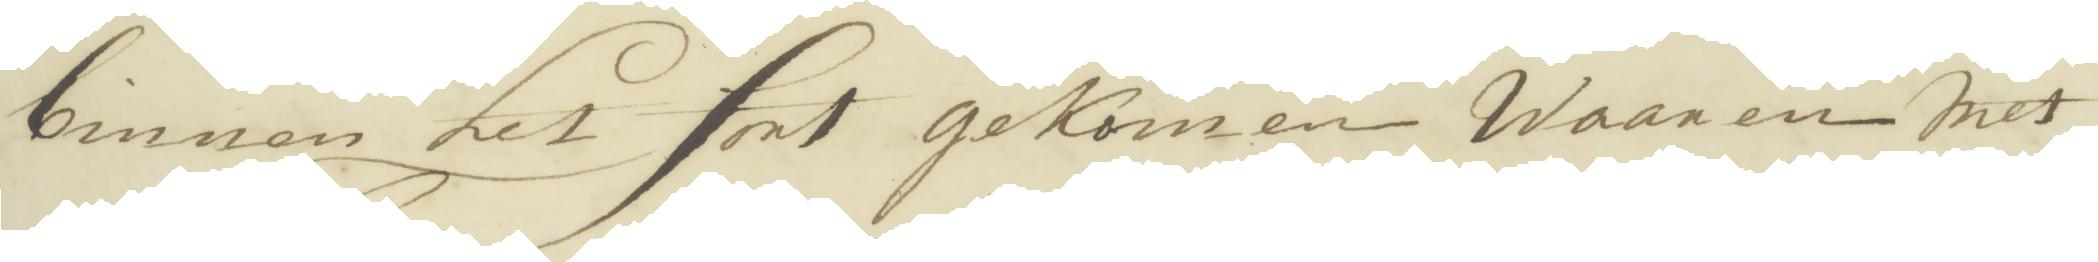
binnen het fort gekomen waar en met
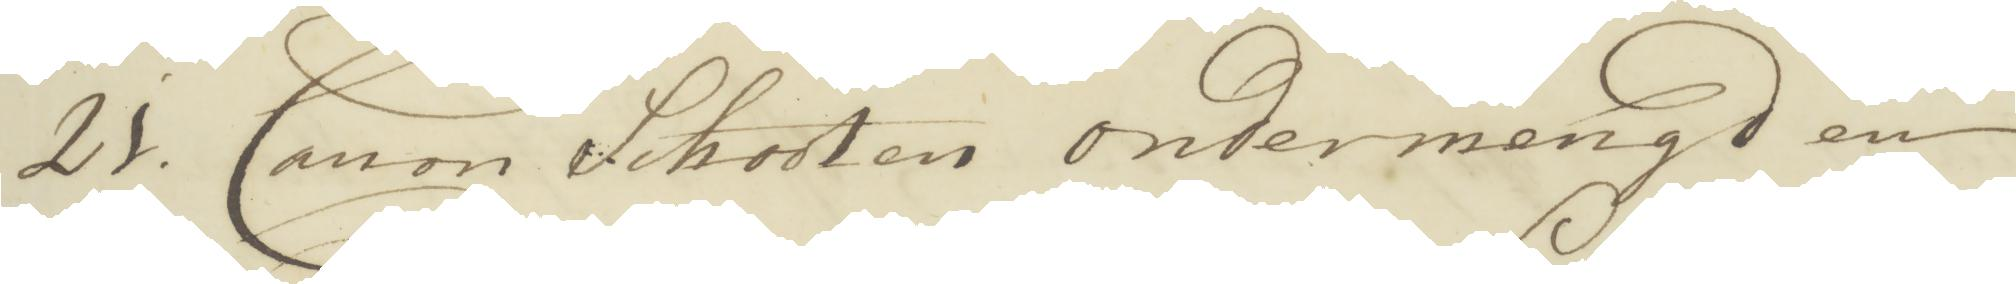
21. Canon schooten ondermengd en
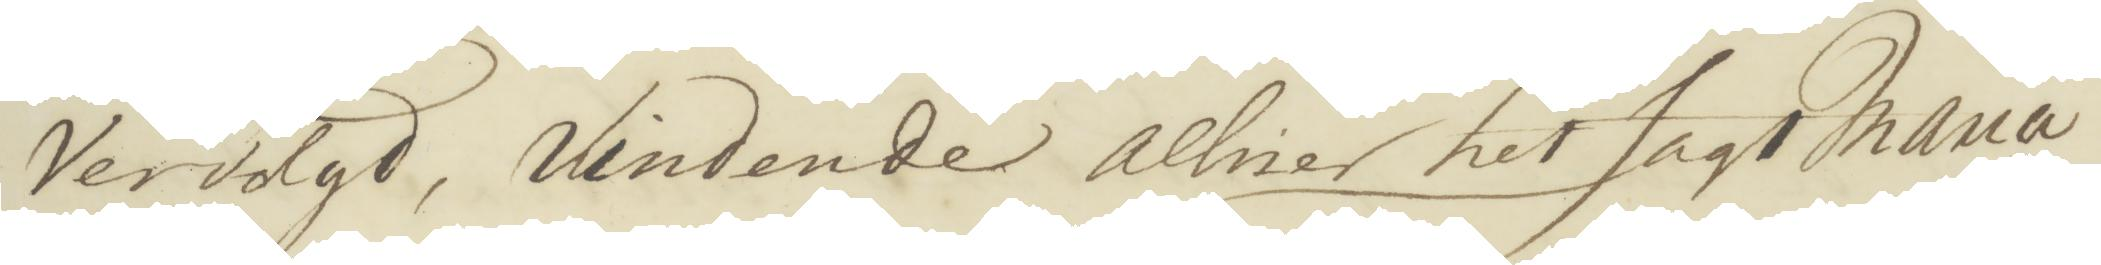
vervolgd, vindende alhier het Jagt Maria
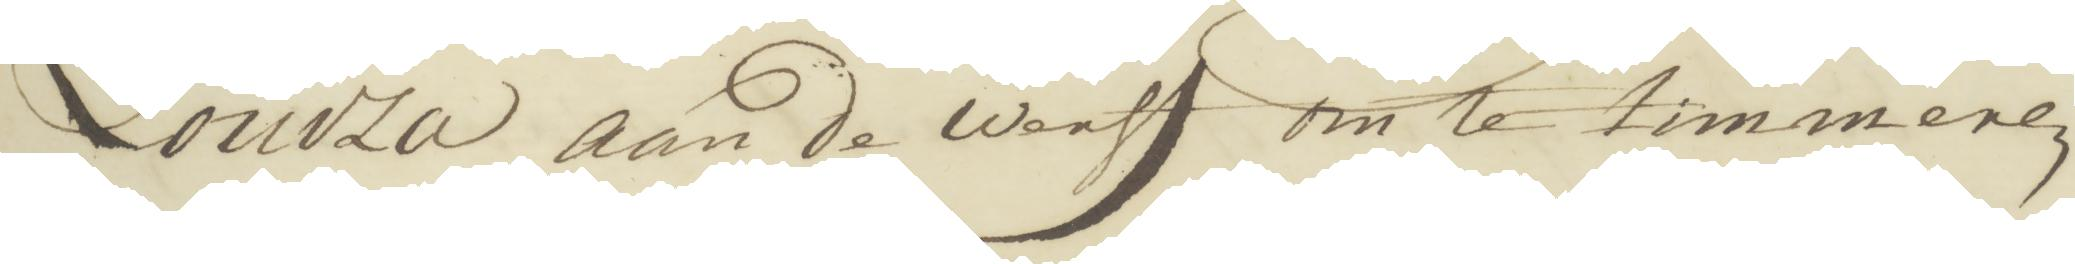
Louiza aan de werff om te timmeren
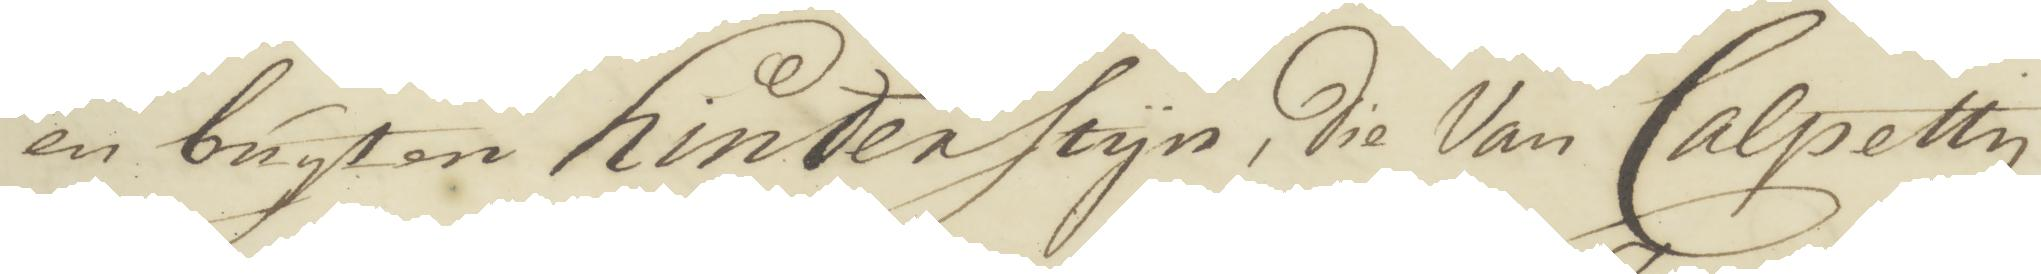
en buyten hinderstijn, die van Calpetij
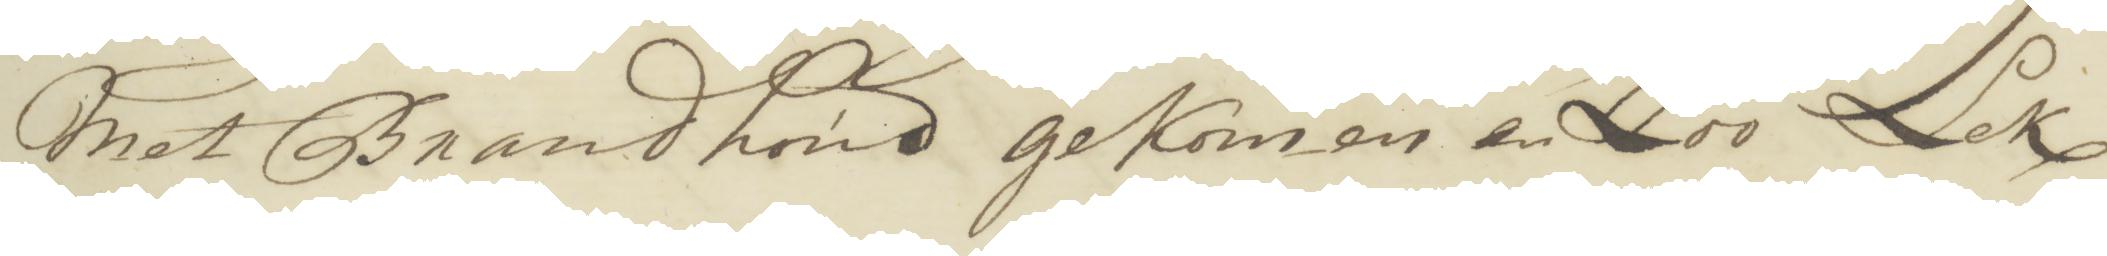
met Brandhoud gekomen en zoo Lek
